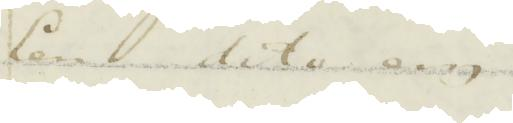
Een dito enz
